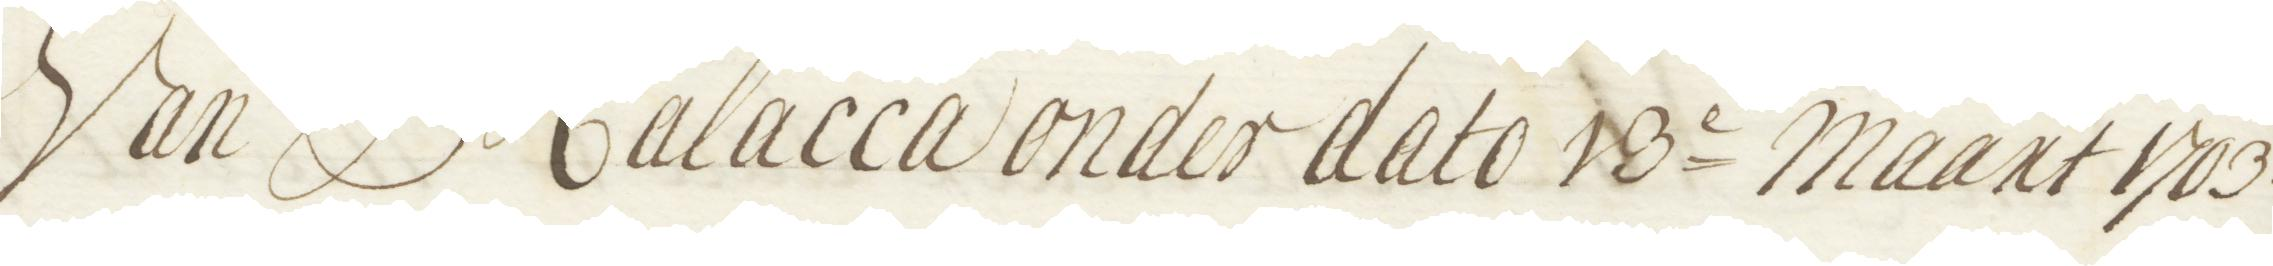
Van Malacca onder dato 13=e Maart 1703:
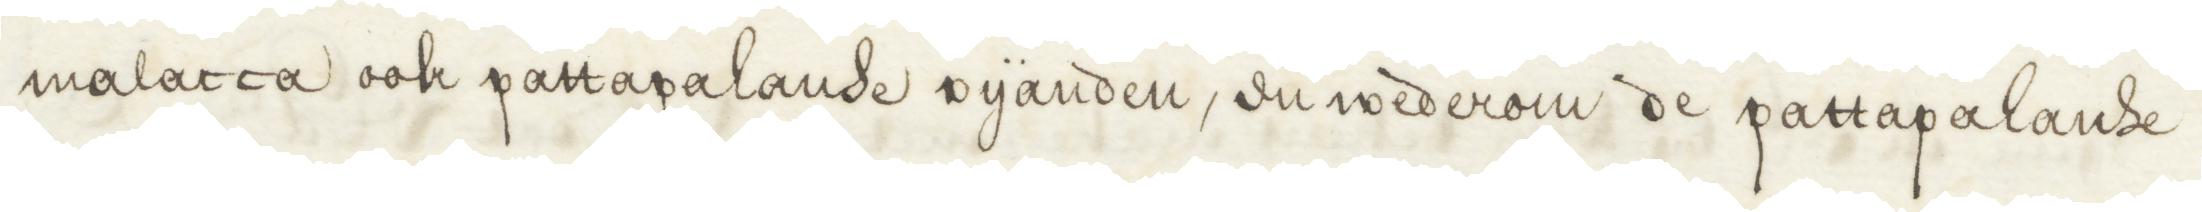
malacca ook pattapalanse vijanden, en wederom de pattapalanse
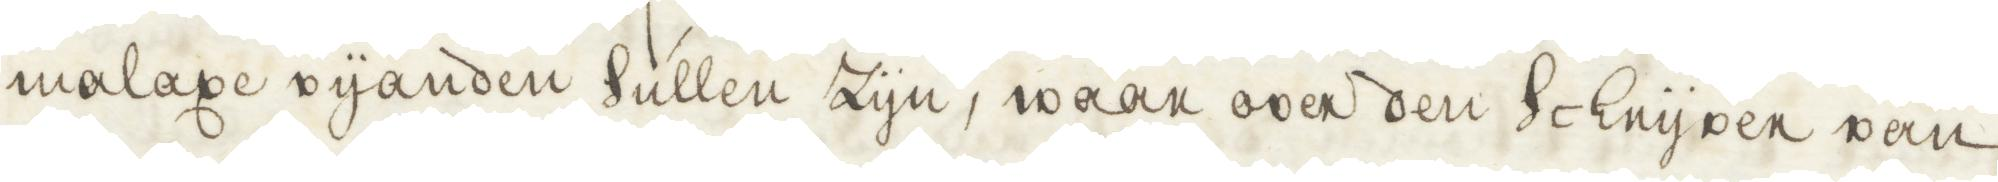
malaxe vijanden sullen zijn, waar over den schrijver van
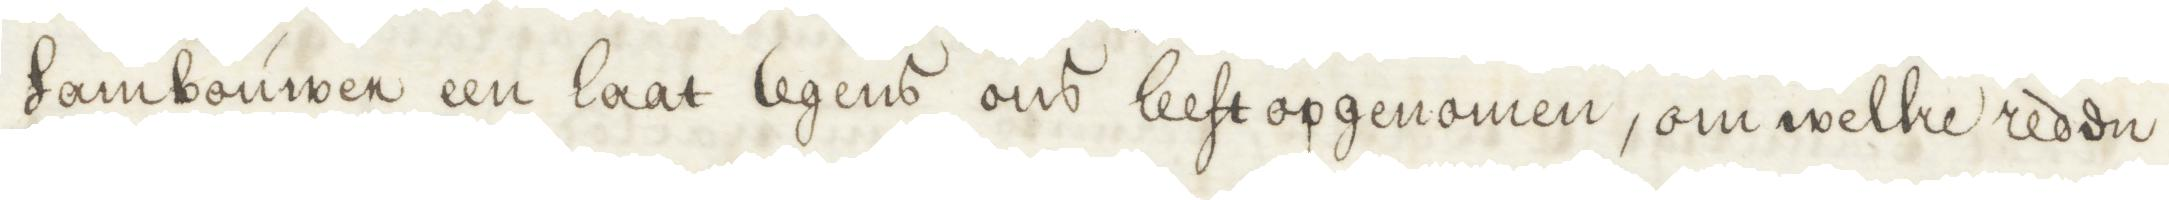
Sambouwer een haat tegens ons heeft opgenomen, om welke reden
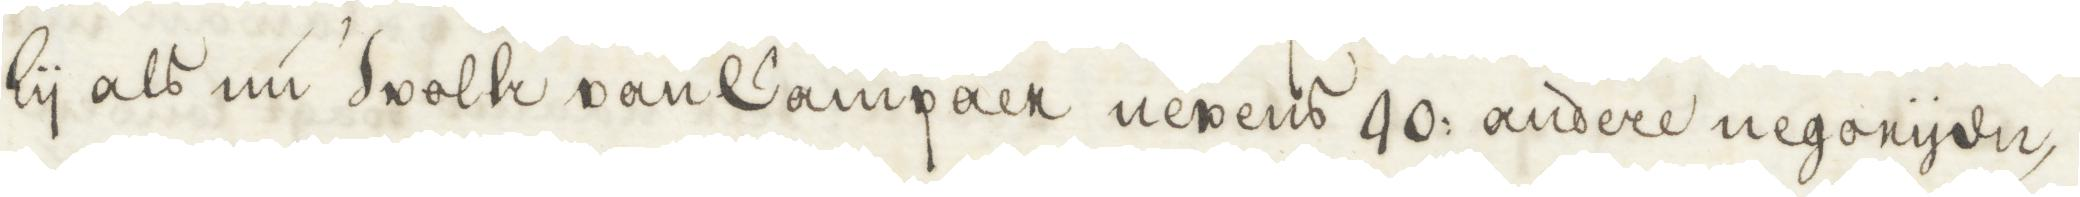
hij als nu 't volk van Kampaer nevens 40: andere negorijen,
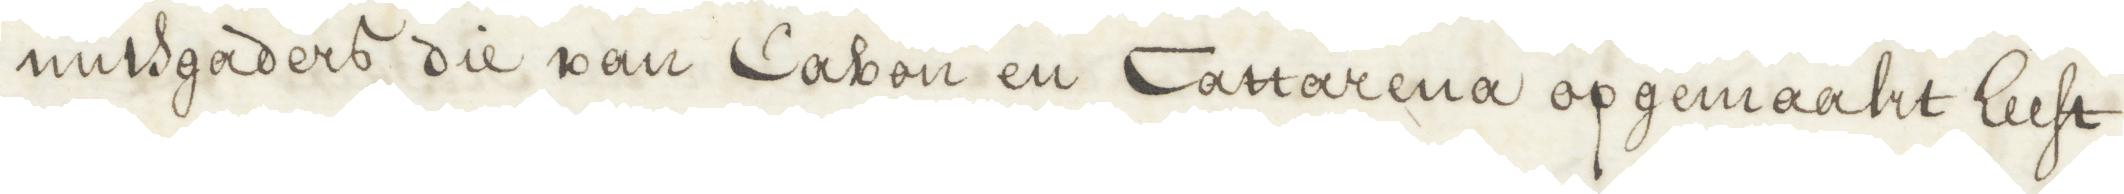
mitsgaders die van Kabon en Cattarena opgemaakt heeft
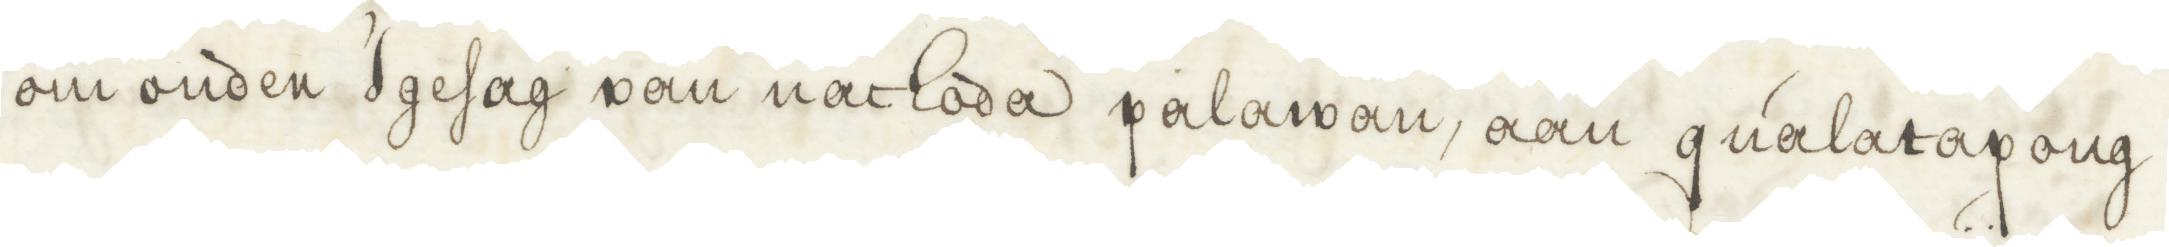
om onder 't gesag van nachoda palawan, aan qualatapong
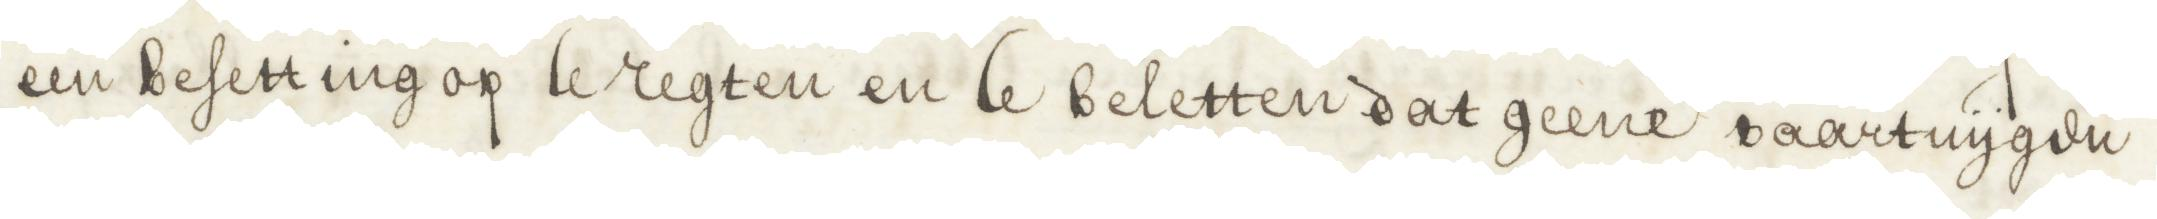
een besetting op te regten en te beletten dat geene vaartuijgen
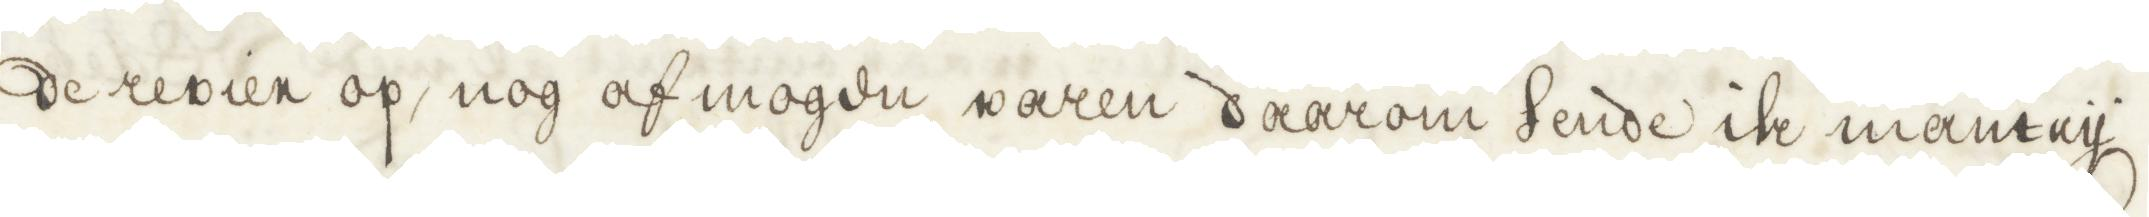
de revier op, nog afmogen varen daarom sende ik mantrij
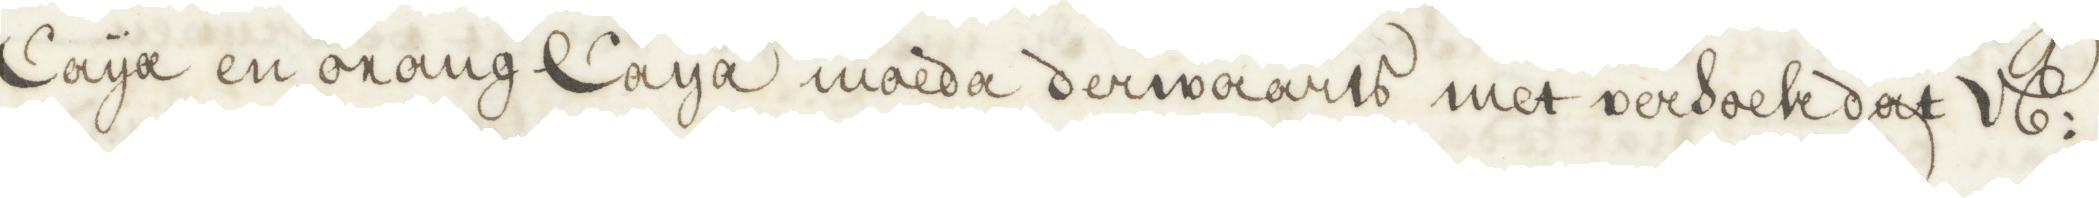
Kaija en orang Kaija moeda derwaarts met versoek dat vE:
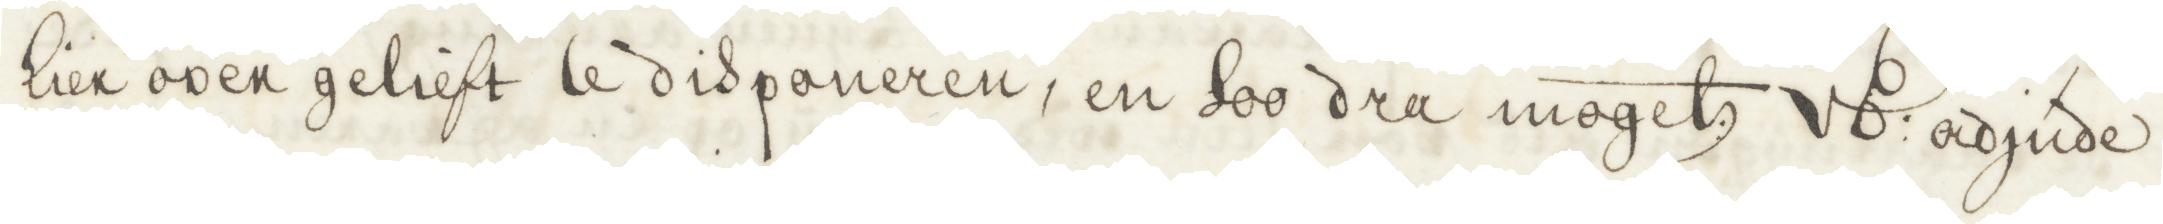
hier over gelieft te disponeren, en soo dra mogelijk: vE: adjude
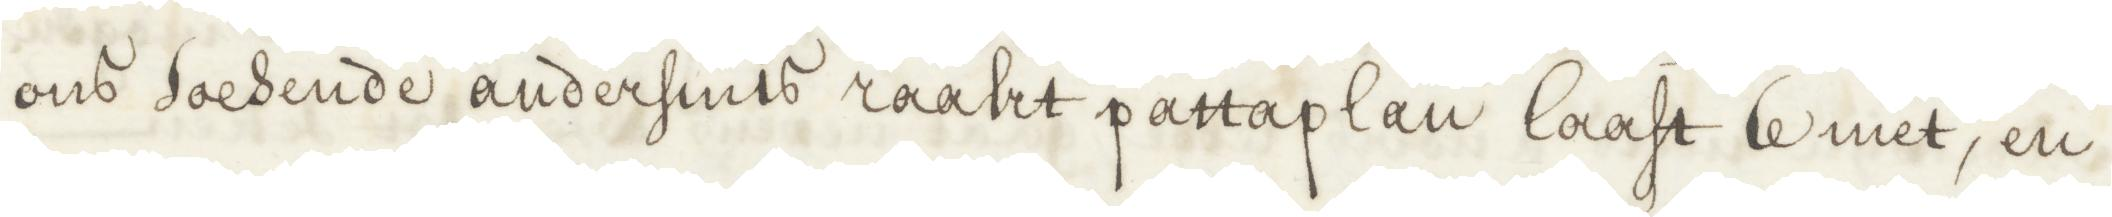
ons toesende andersints raakt pattaplan laast te niet, en
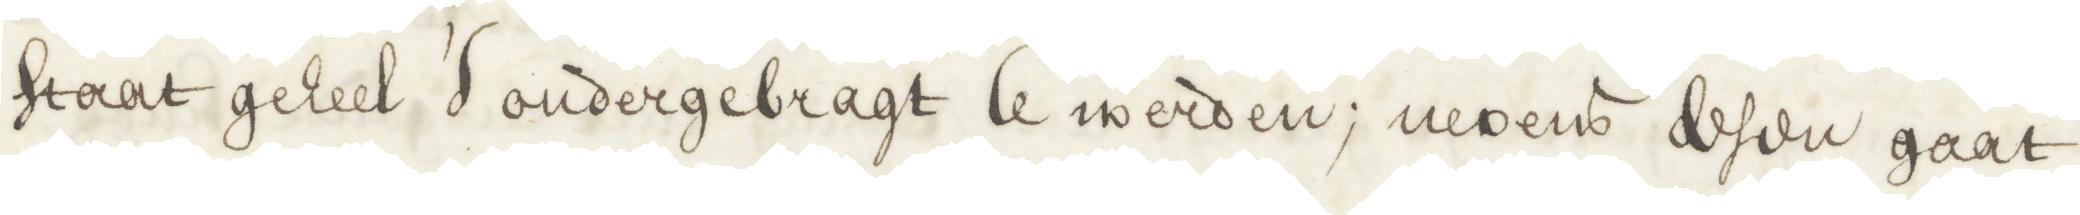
staat geheel 't ondergebragt te werden; nevens desen gaat
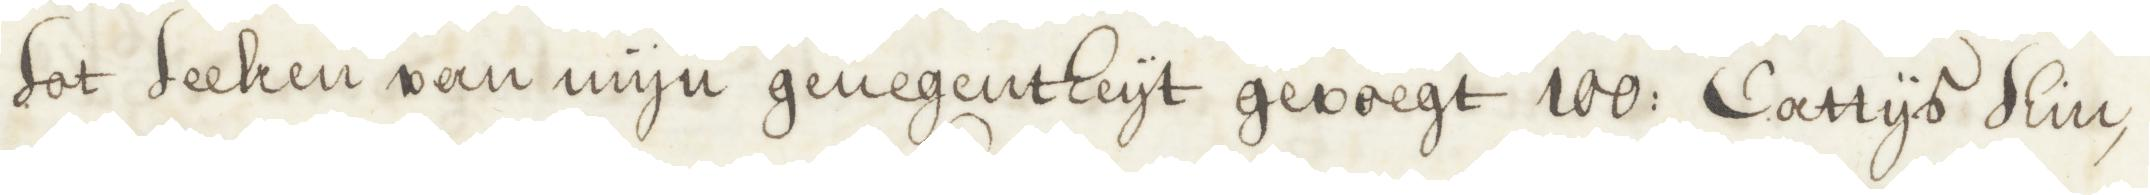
tot teeken van mijn genegentheijt gevoegt 100: Kattijs thin,
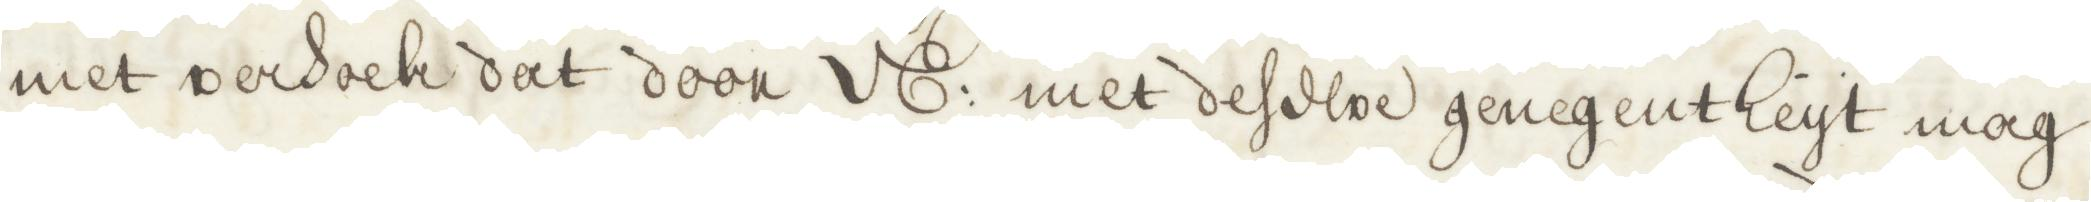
met versoek dat door VE: met deselve genegentheijt mag
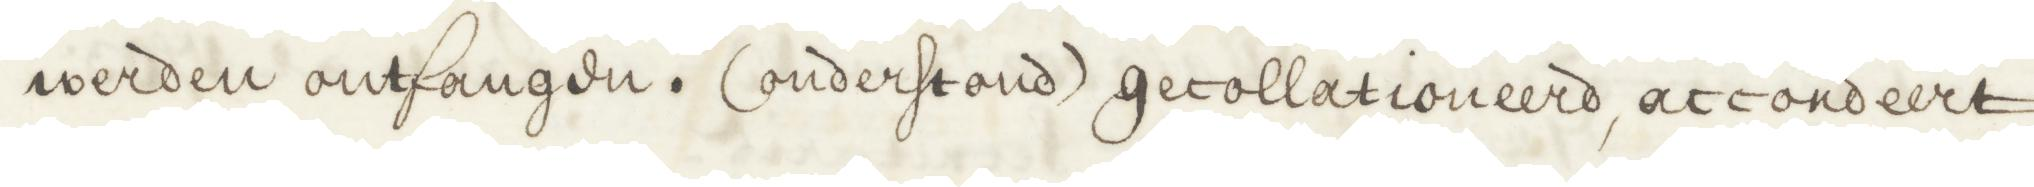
werden ontfangen. (onderstond) gecollationeerd, accordeert
